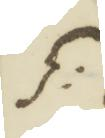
T:
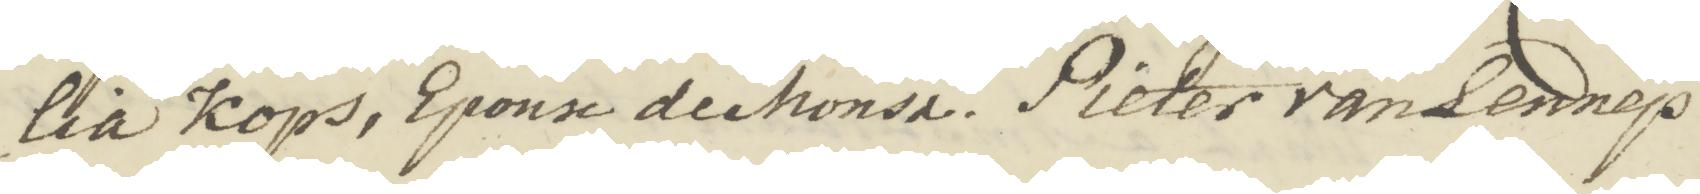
=lia Kops, Epouse de Monsr. Pieter van Lennep
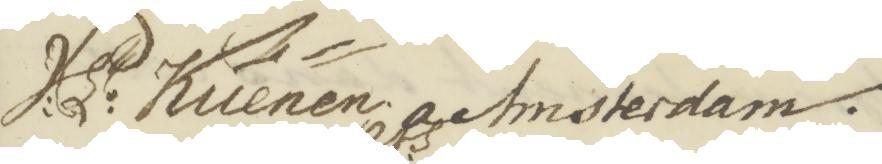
J:P: Kuenen a Amsterdam.
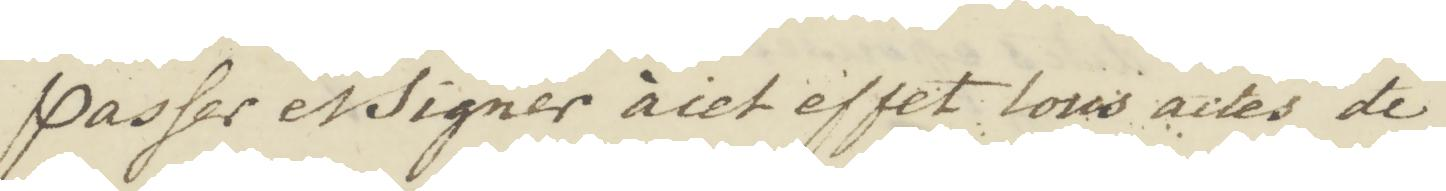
Passes et signer à cet effet tous actes de
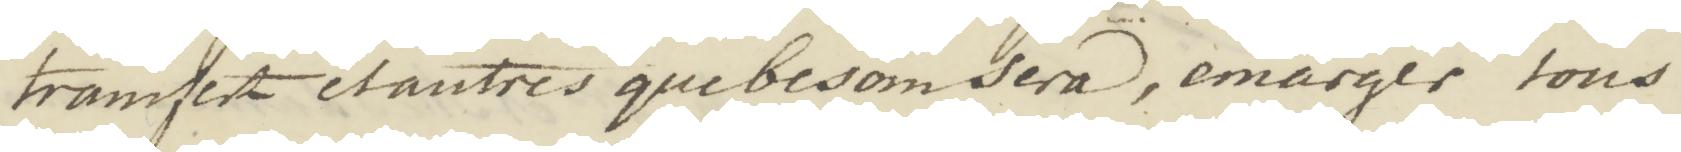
transfert et autres que besoin sera, emarger tous
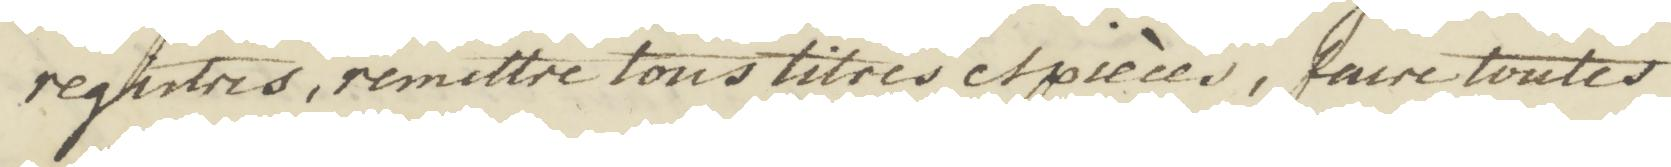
registres, remettre tous titres et pièces, faire toutes
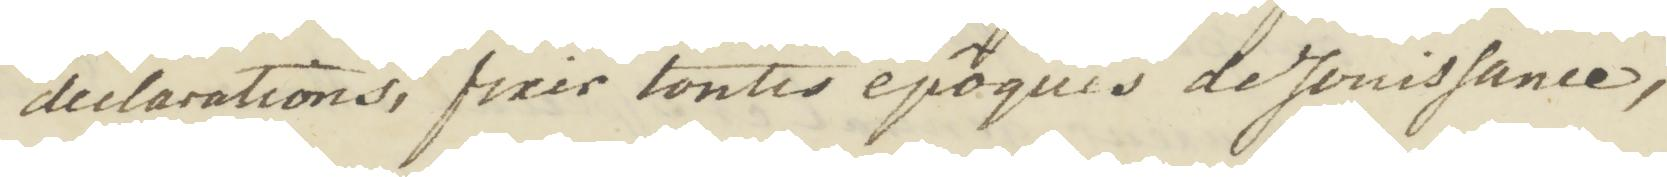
declarations, fixer toutes epôques de Jouissance,
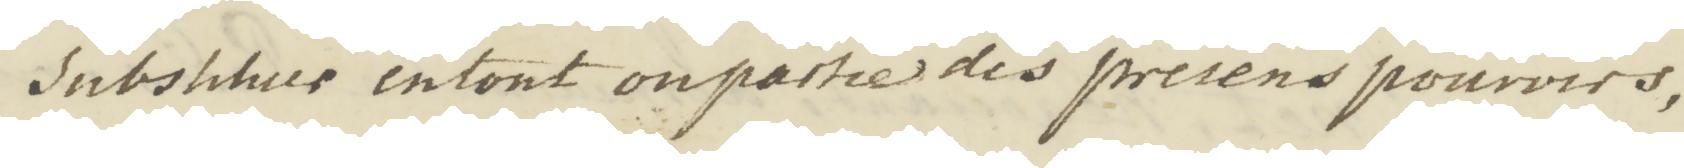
substitutes en tout on partie des presens pouvoirs,
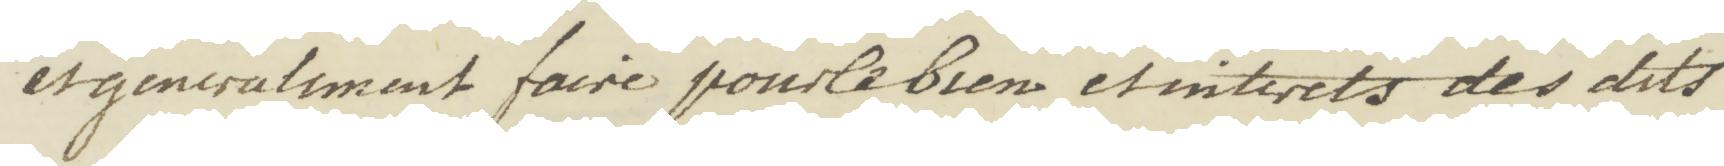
et generaliment faire pour le bien et interets des dits
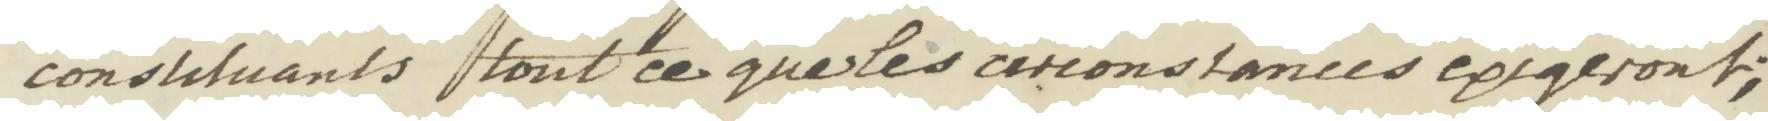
constituants tout ce queles circonstances exjeront;
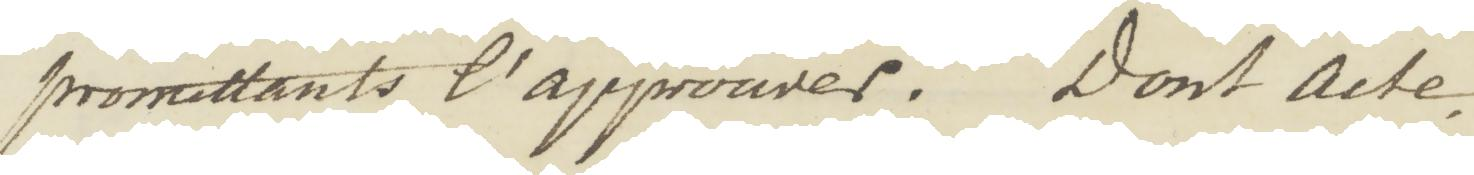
promittants l'approuver. Dont Acte.
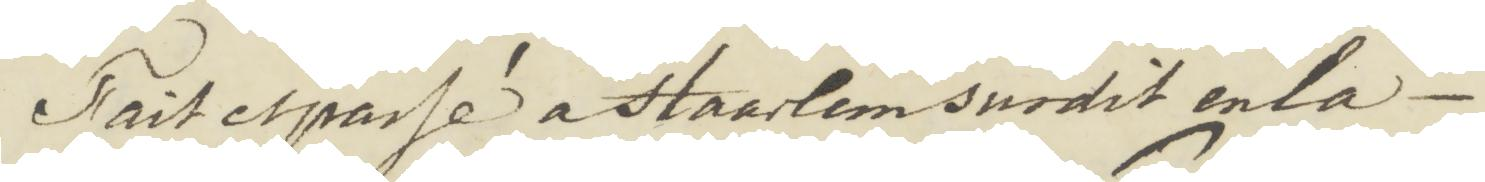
Fait et passé a Haarlem sur dit en la
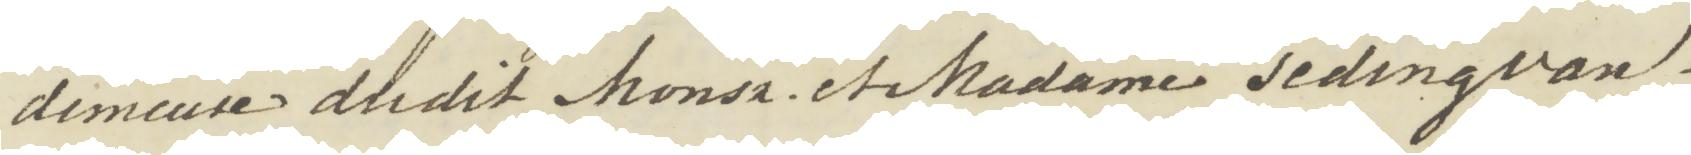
dimense du dit Monsr. et Madame Teding van
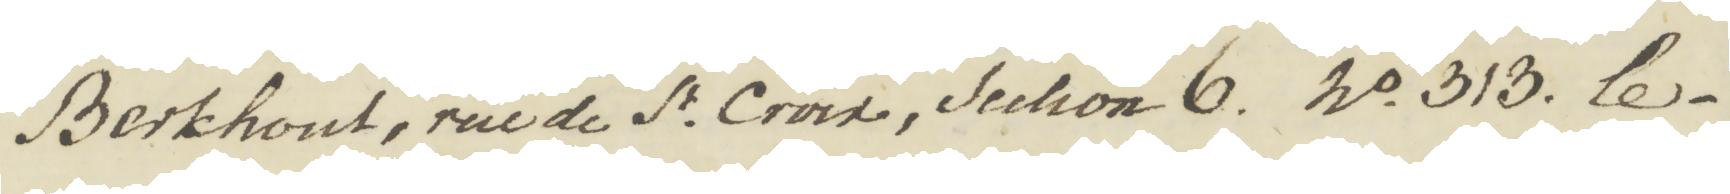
Berkhout, rue de S.t Croix, Sechon 6. N.o 313. le
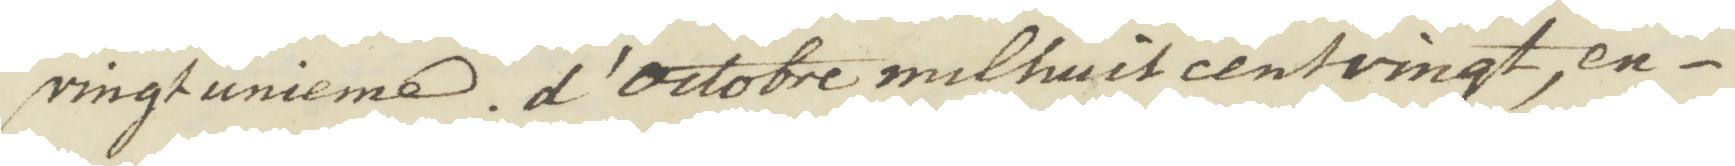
vingtunieme. d’Octobre milhuit cent vingt, en -
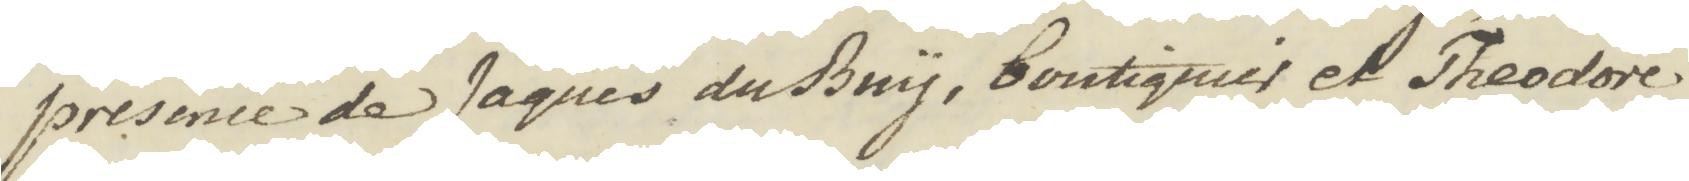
presence de Jaques du Buij, boutiques et Theodore
